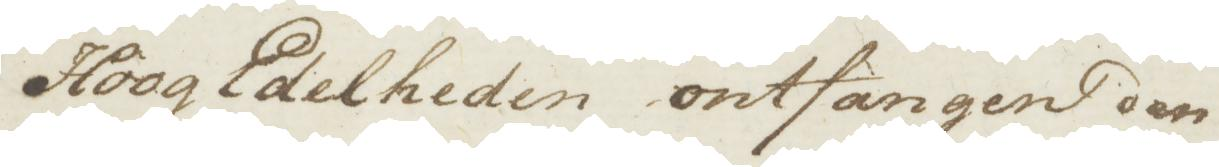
Hoog Edelheden ontfangen den
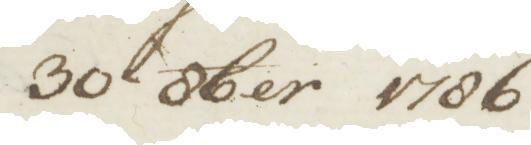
30e 8ber 1786
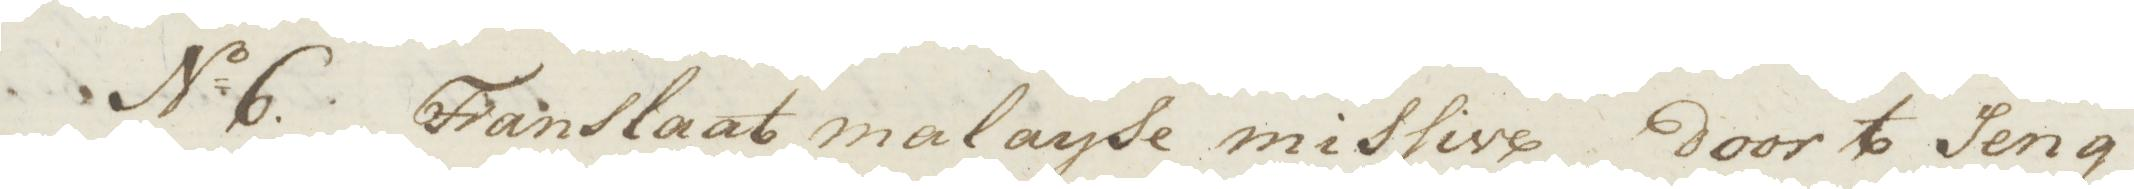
N=o 6. Translaat malayse missive door t Seng
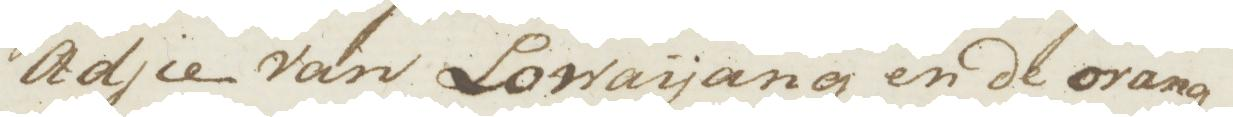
Adjie van Lowaijang en de orang
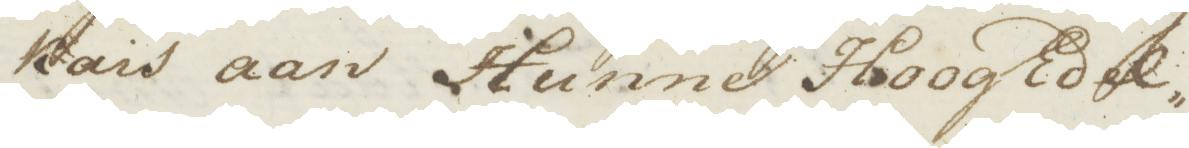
Kais aan Hunne Hoog Edel„
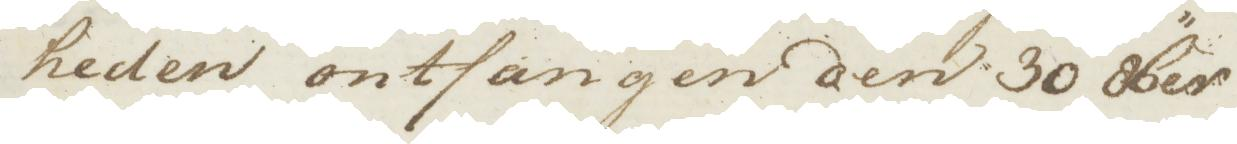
heden ontfangen den 30 8ber
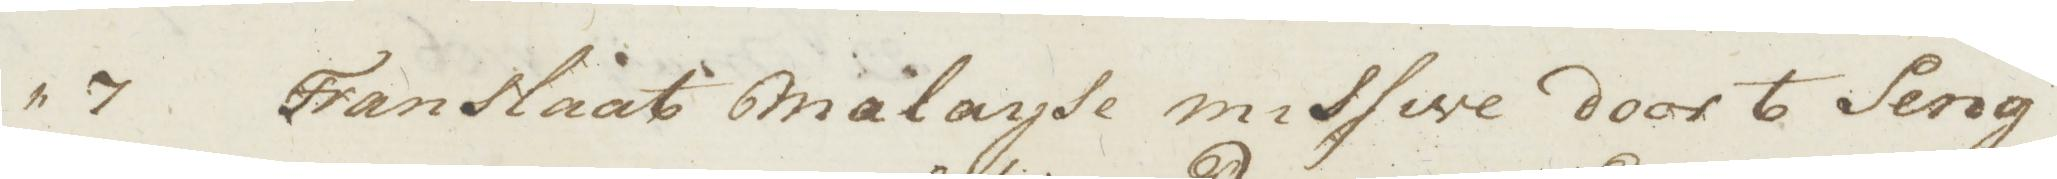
„ 7 Translaat malayse missive door t Seng
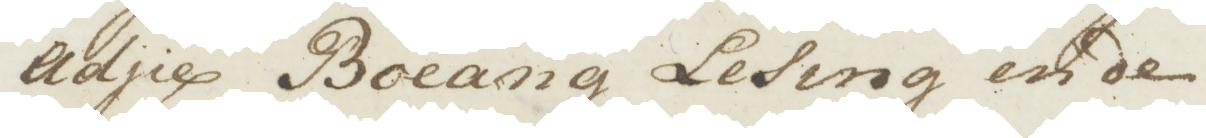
adjie Boeang Lesing en de
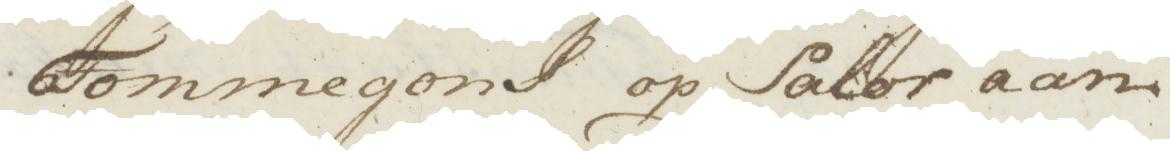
Tommegons op Salor aan
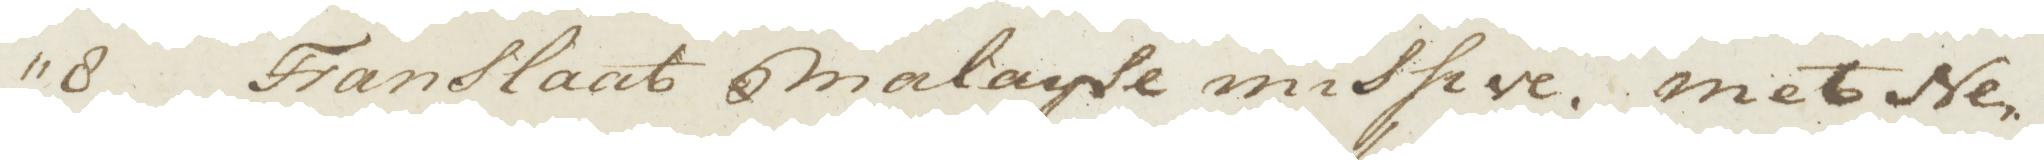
„ 8 Translaat malayse missive, met Ne„
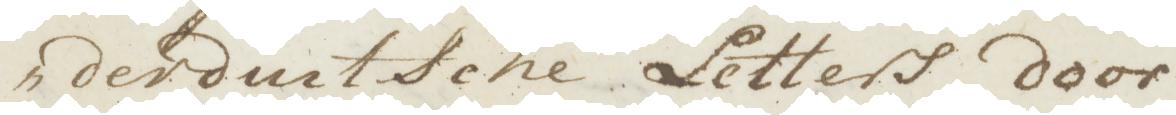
„derduitsche Letters door
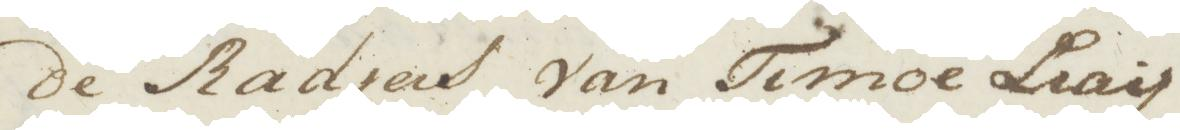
de Radjas van Timoe Liaij
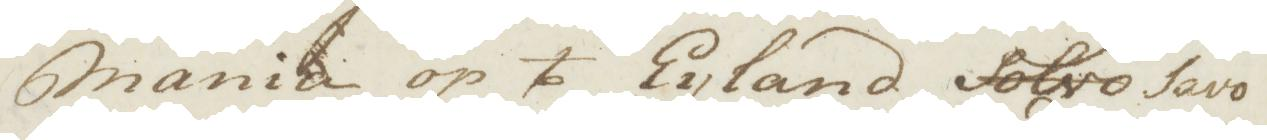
Mania op t Eyland solvo savo
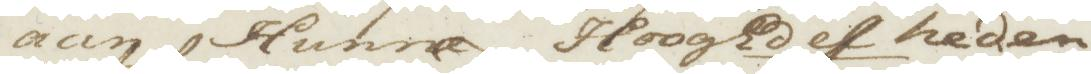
aan Hunne Hoog Edelheden
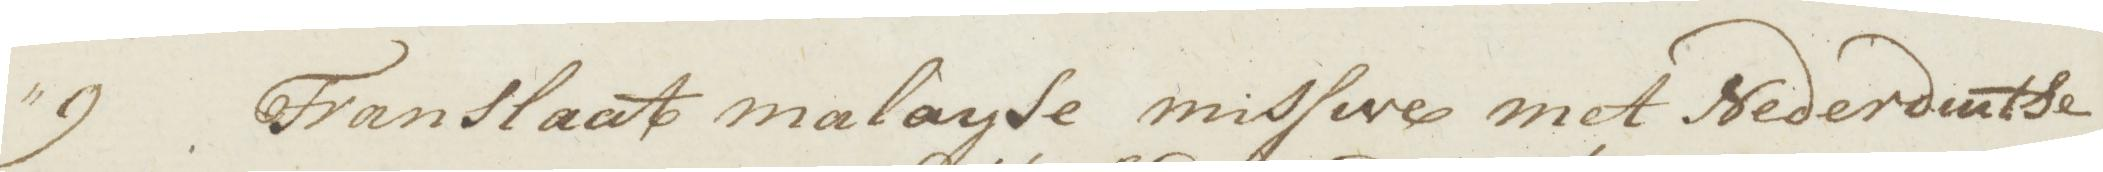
„ 9 Translaat malayse missive met Nederduitse
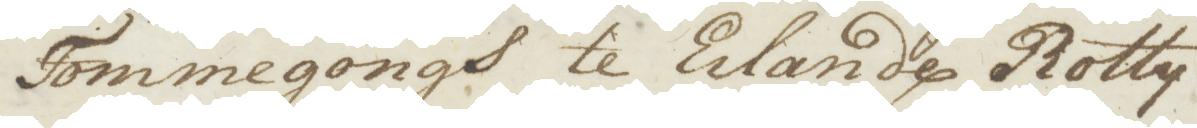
Tommegongs te Eilande Rotty
